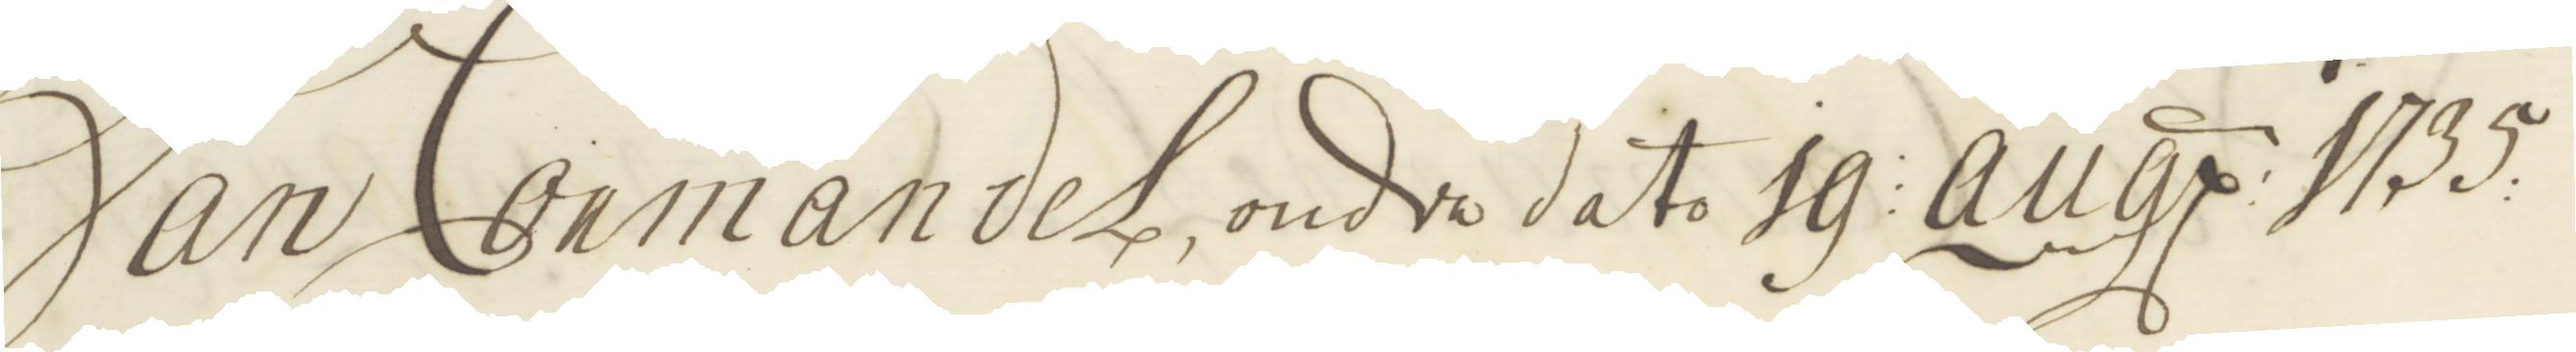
Van Cormandel, onder dato 19: augx: 1735:
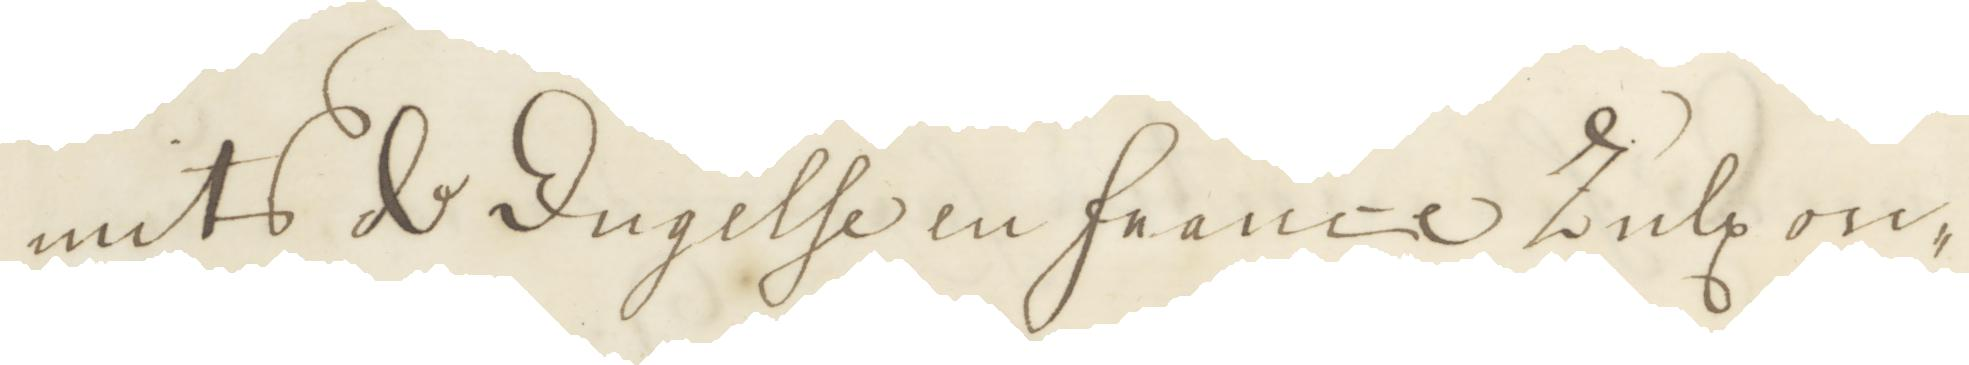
mits de Engelse en france zulx on„
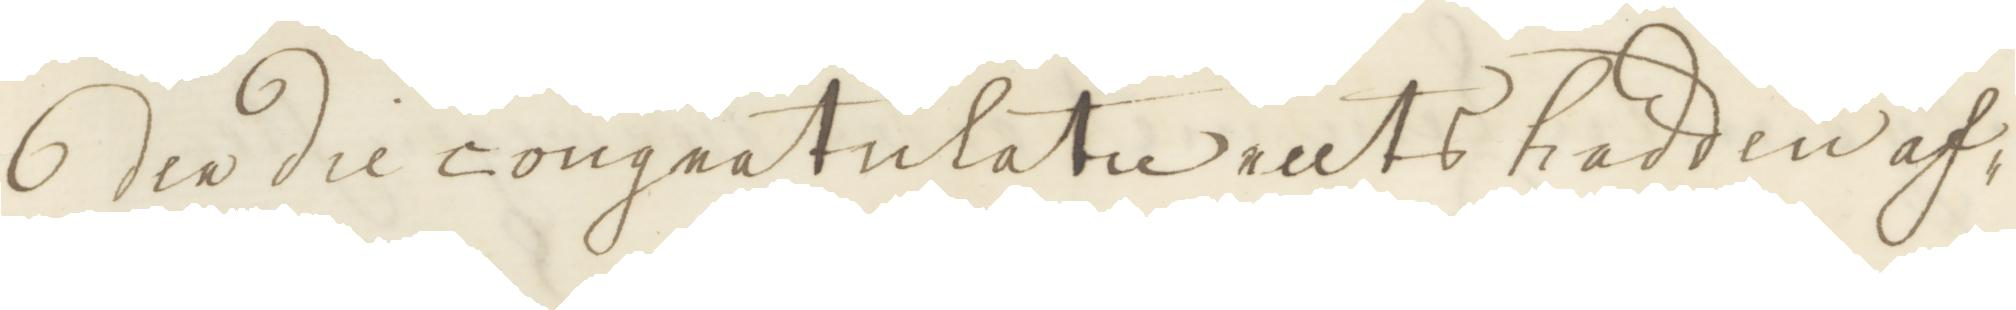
der die congratulatie reets hadden af„
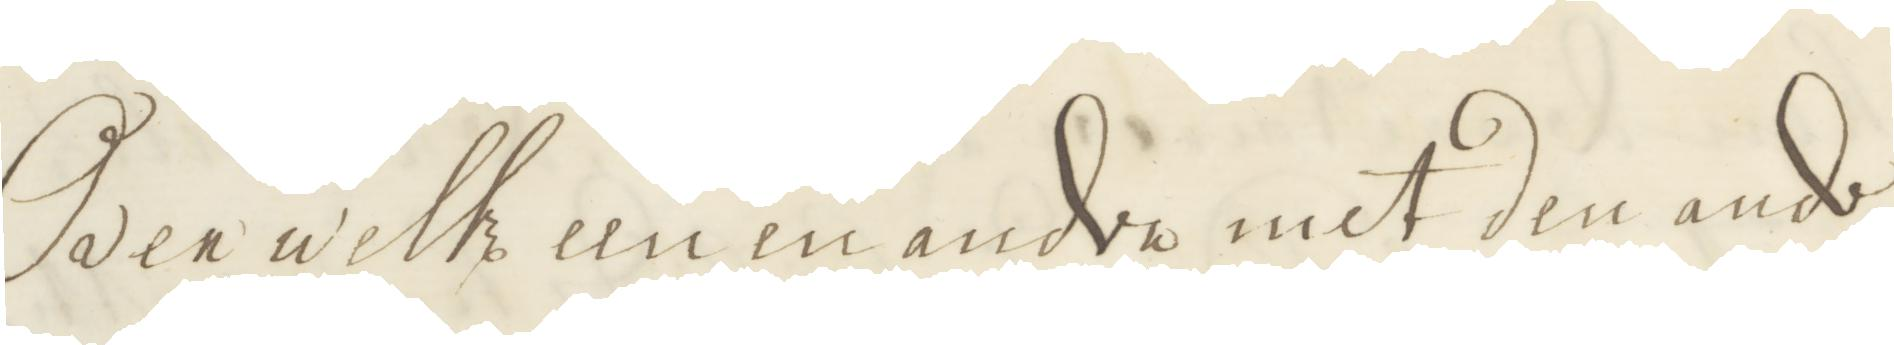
Over welk een en ander met den ande
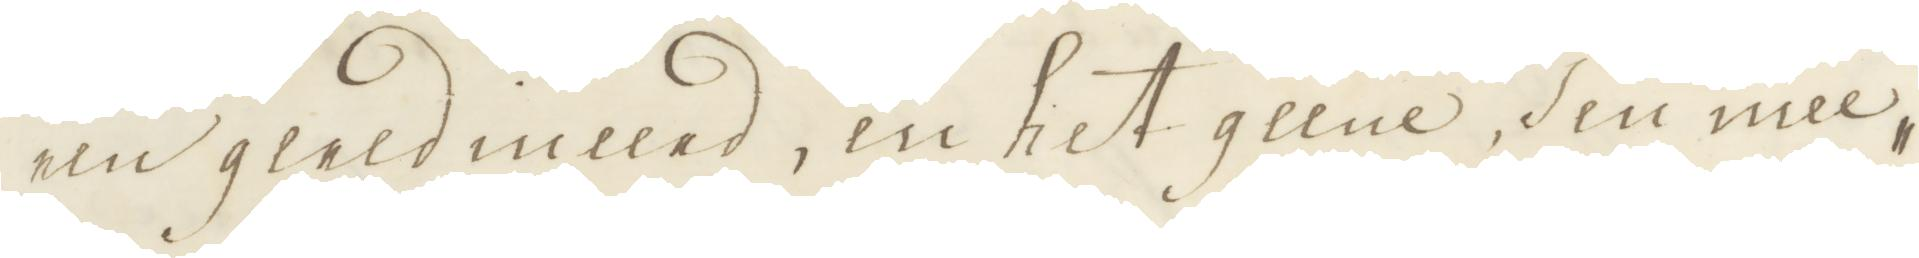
ren geredineerd, en het geene, Ten mee„
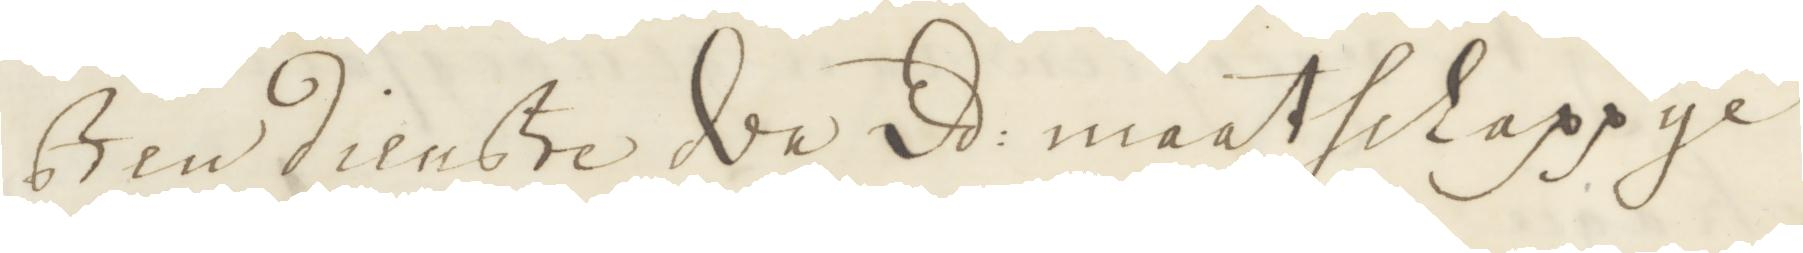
sten dienste der Ed: maatschappije
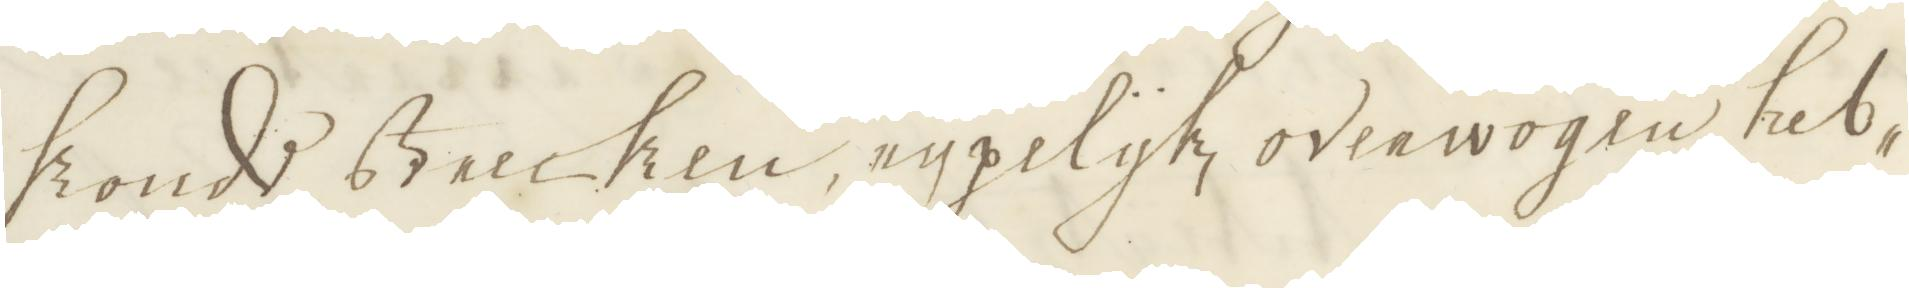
konde strecken, rijpelijk overwogen heb„
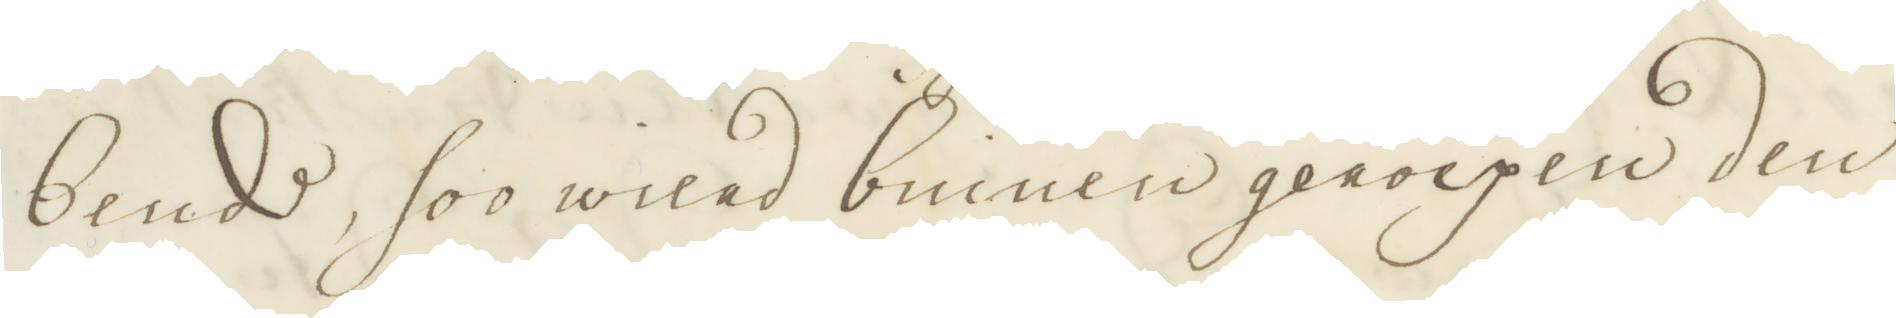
bende, soo wierd binnen geroepen den
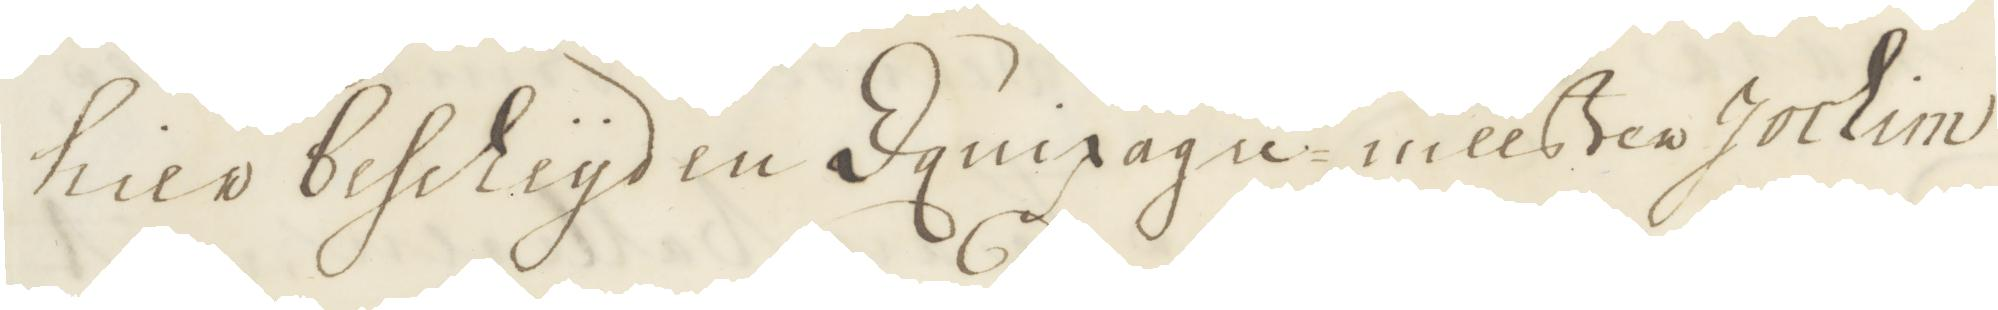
hier bescheijden Equipagie=meester Jochim
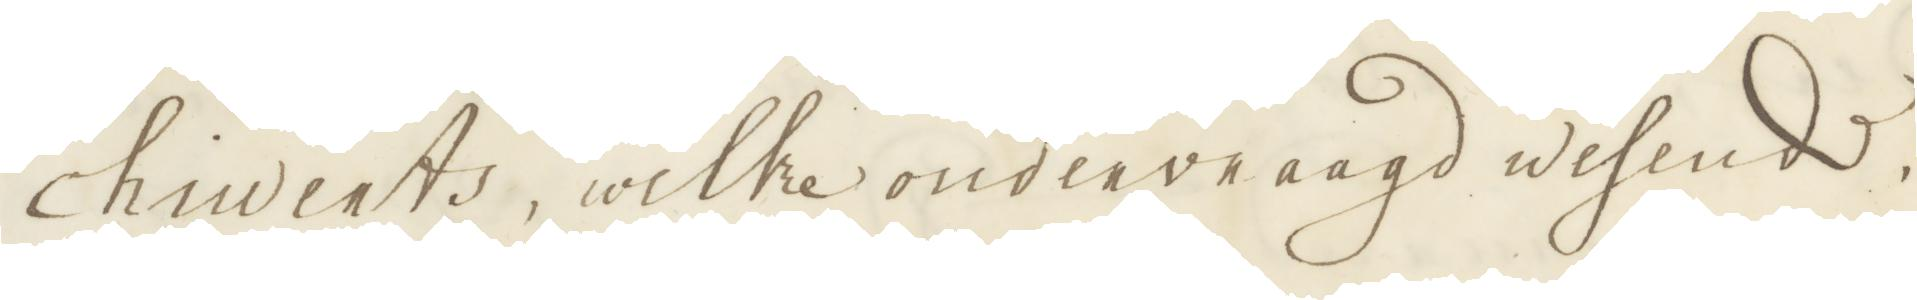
chiwerts, welke ondervraagd wesende
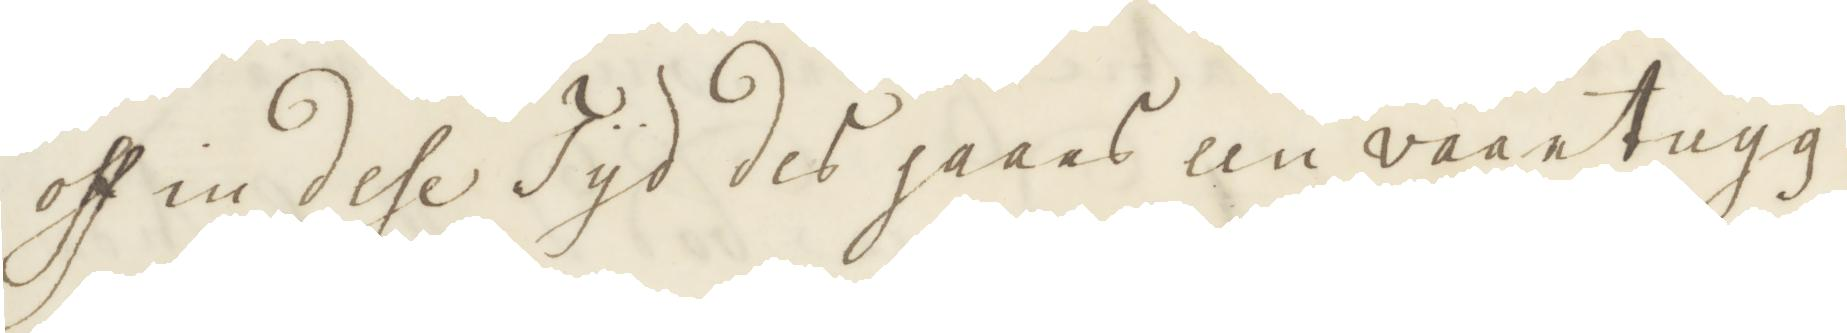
off in dese Tijd des jaars een vaartuijg
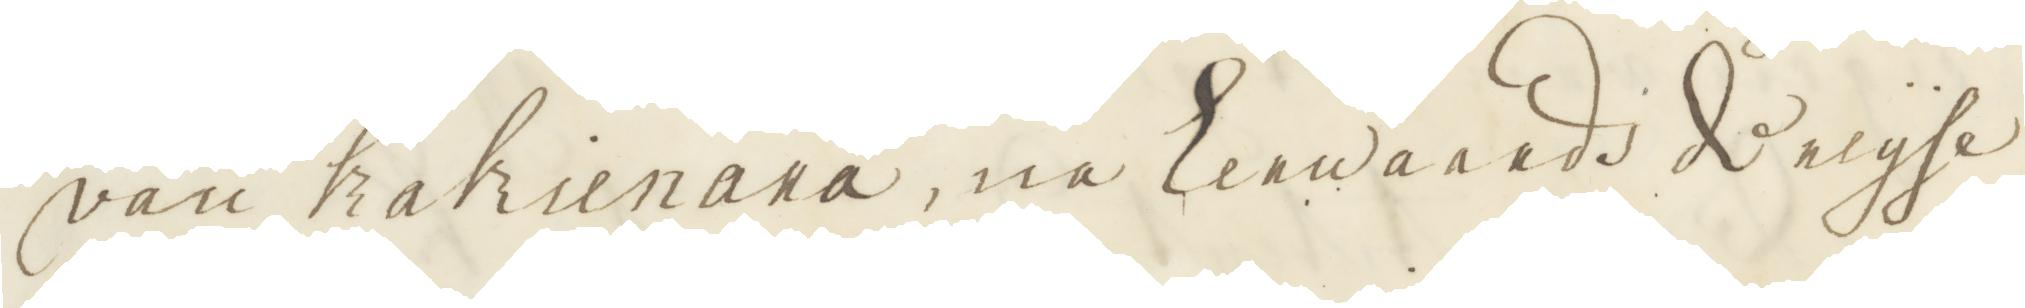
van kakienara, na herwaards de reijse
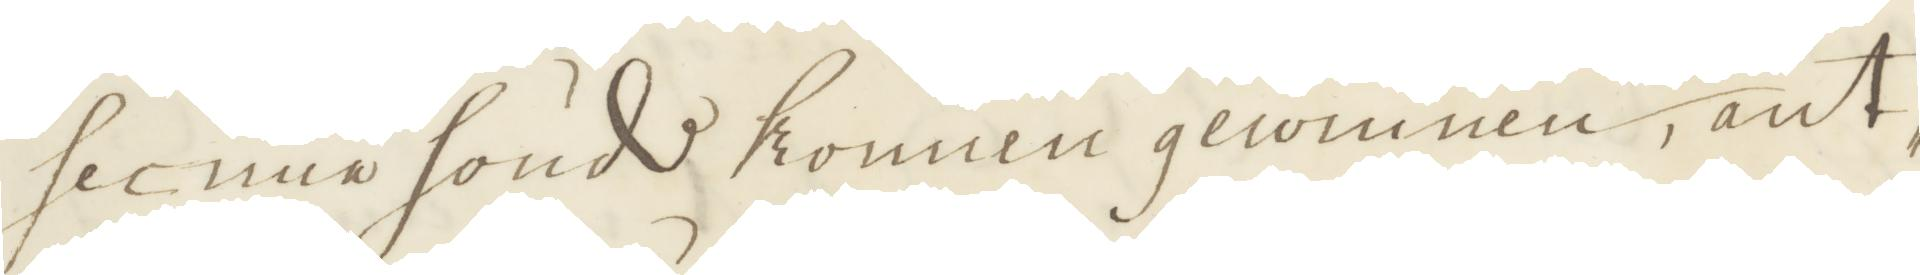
secuur soude konnen gewinnen, ant
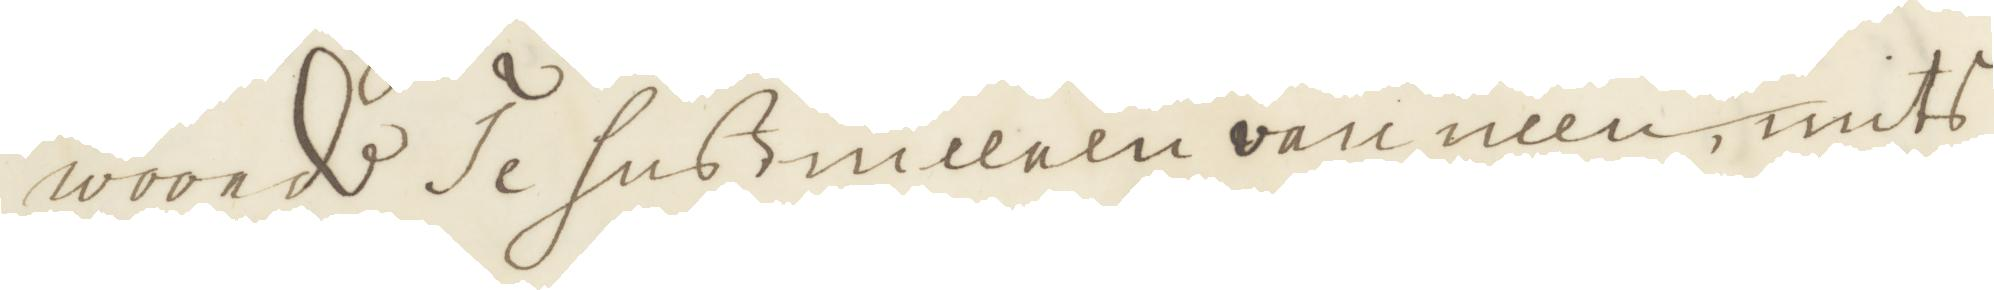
woorde Te sustineeren van neen, mits
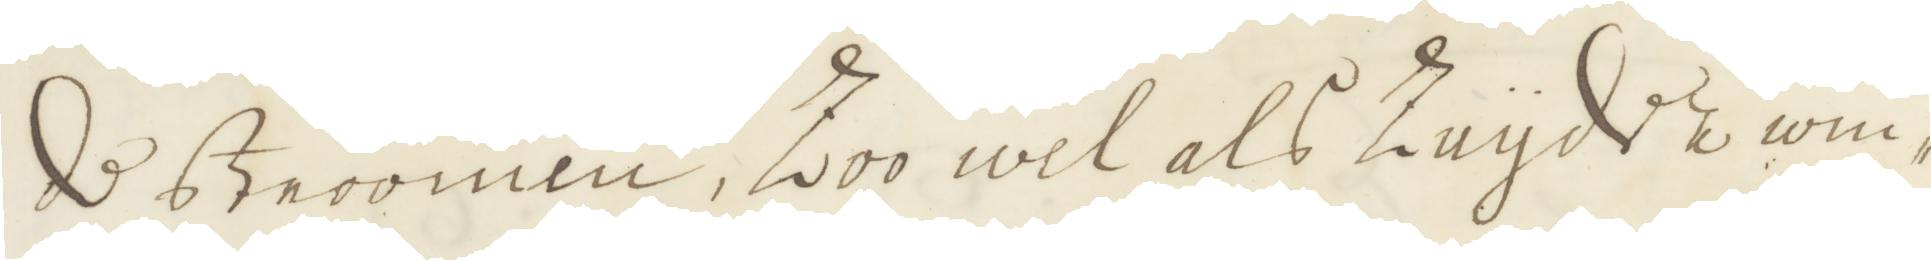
de stroomen, zoo wel als zuijder win
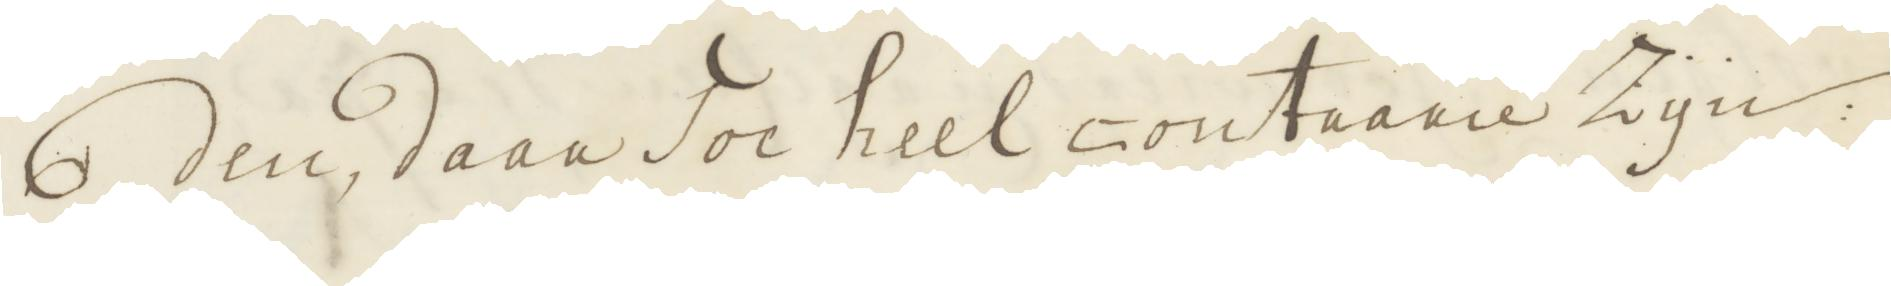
den, daar Toe heel contrarie zijn
